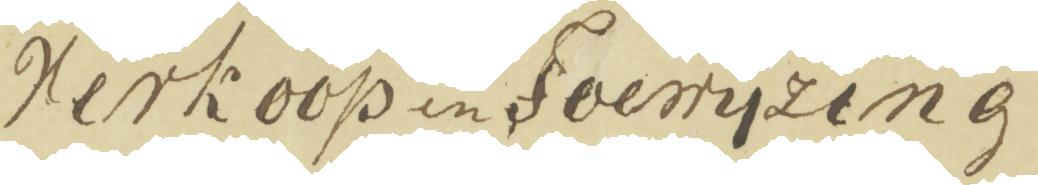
Verkoop en Toewijzing
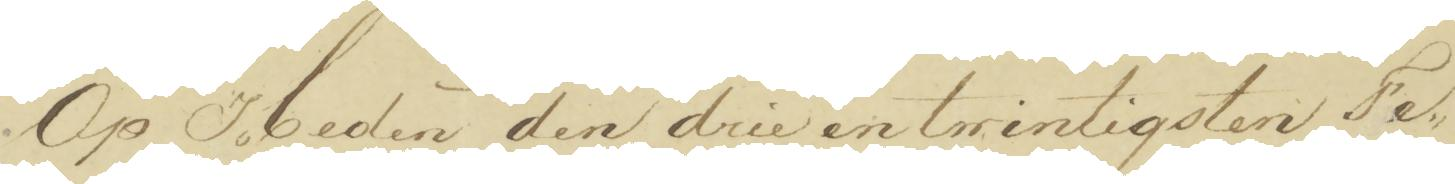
Op Heden den drie en twintigsten Fe„
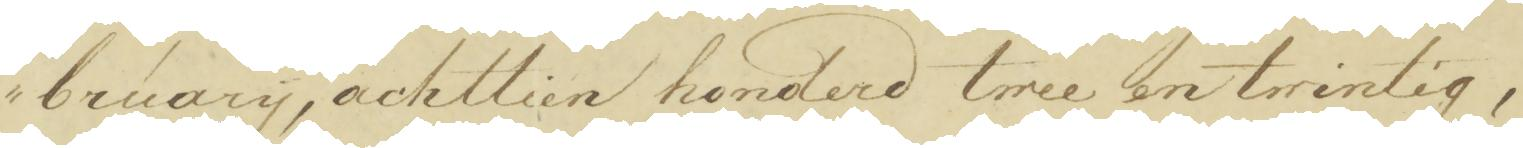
„bruarij, achttien honderd twee en twintig,
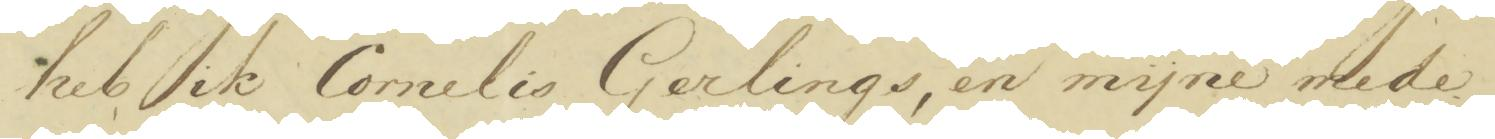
heb ik Cornelis Gerlings, en mijne mede
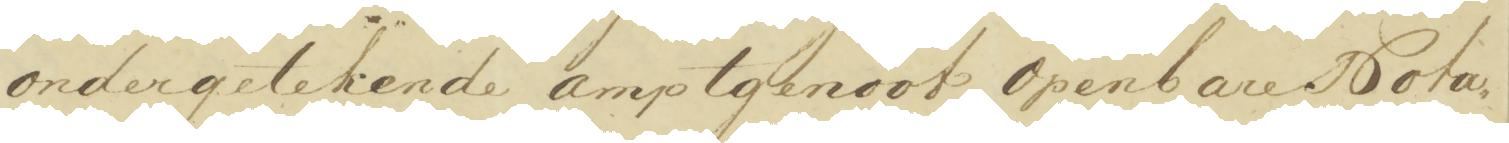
ondergetekende amptgenoot, Openbare Nota„
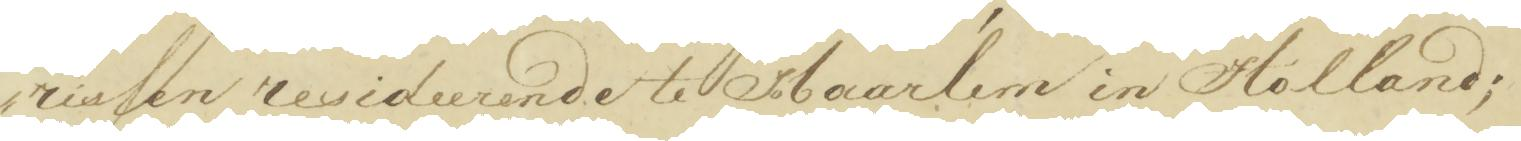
„rissen resideerende te Haarlem in Holland;
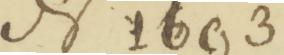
No 1693
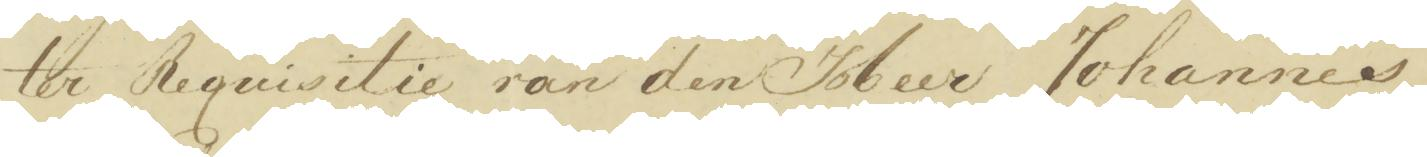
ter Requisitie van den Heer Johannes
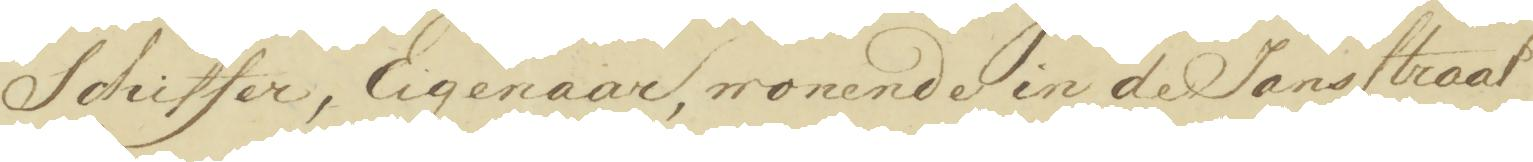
Schiffer, Eigenaar, wonende in de Iansstraat
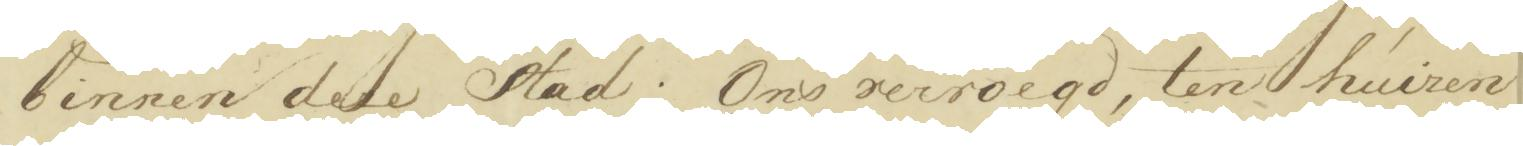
binnen deze Stad; Ons vervoegd, ten huizen
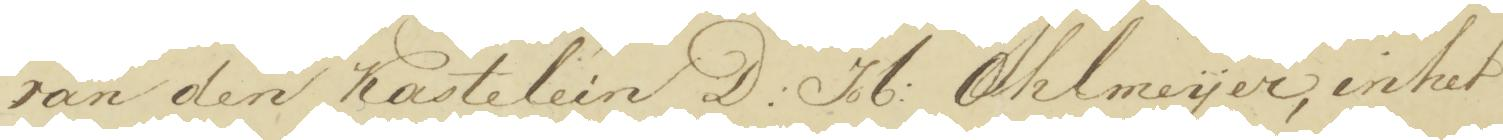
van den Kastelein D: H: Ohlmeijer, in het
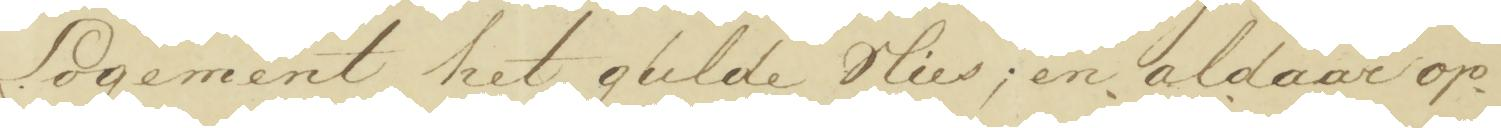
Logement het gulde Vlies; en aldaar op
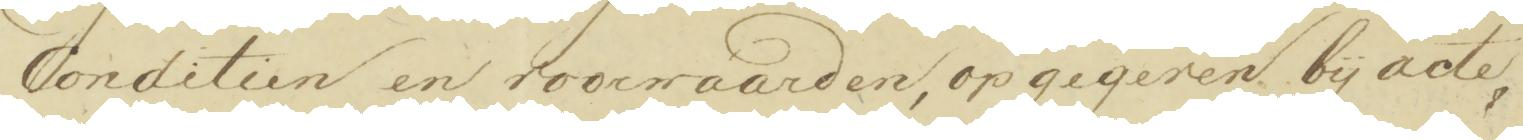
Conditien en voorwaarden, op gegeven bij acte„
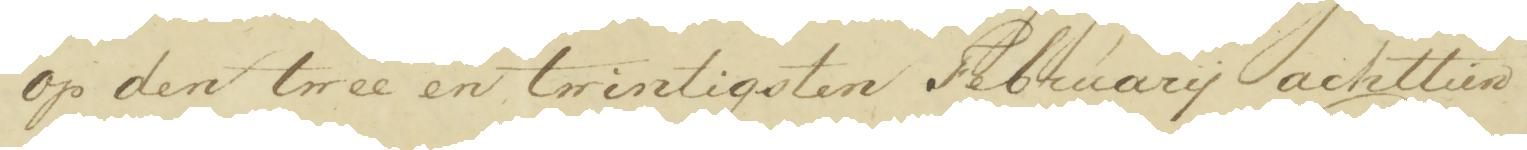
op den twee en twintigsten Februarij achttien
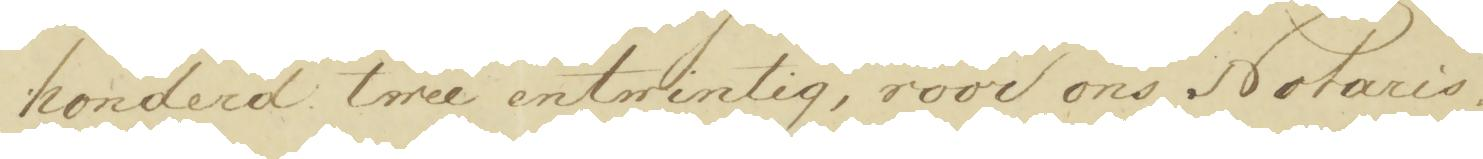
honderd twee en twintig, voor ons Notaris
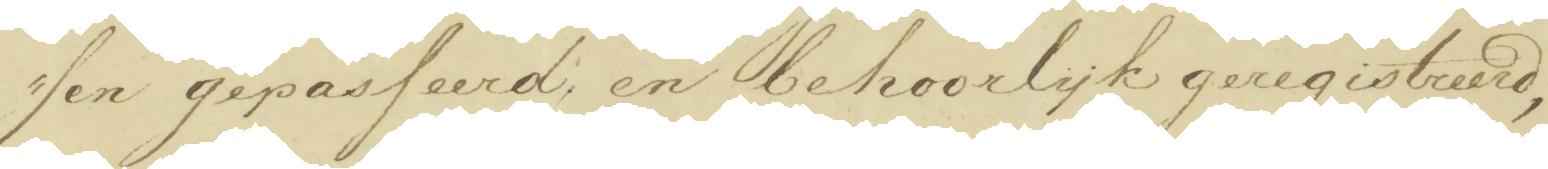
„sen gepasseerd, en behoorlijk geregistreerd,
